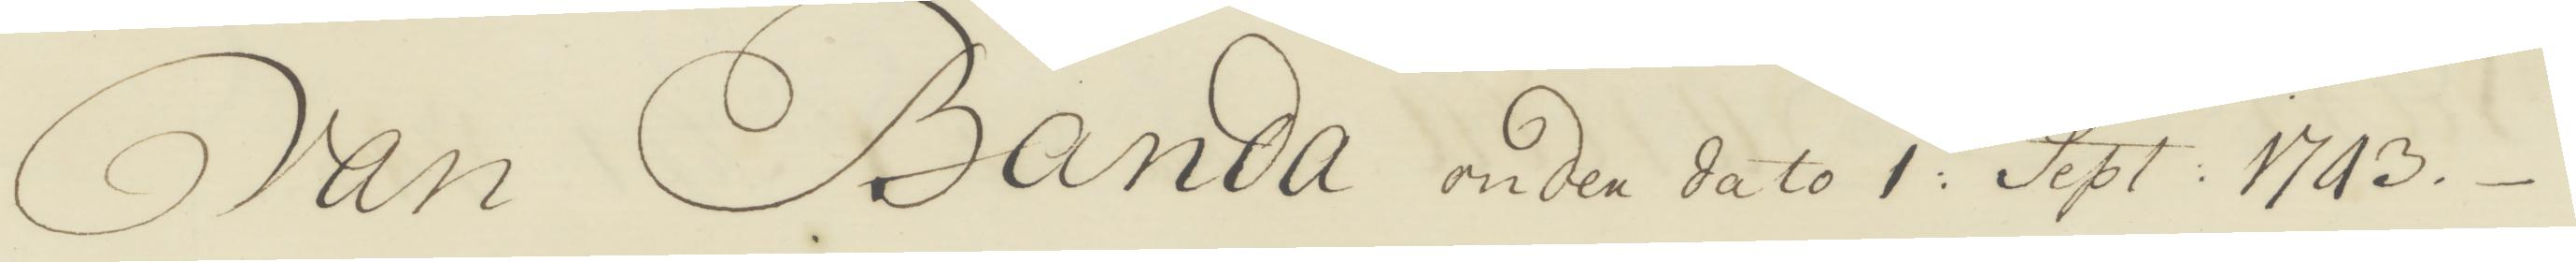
Van Banda onder dato 1:' Sept: 1743. —
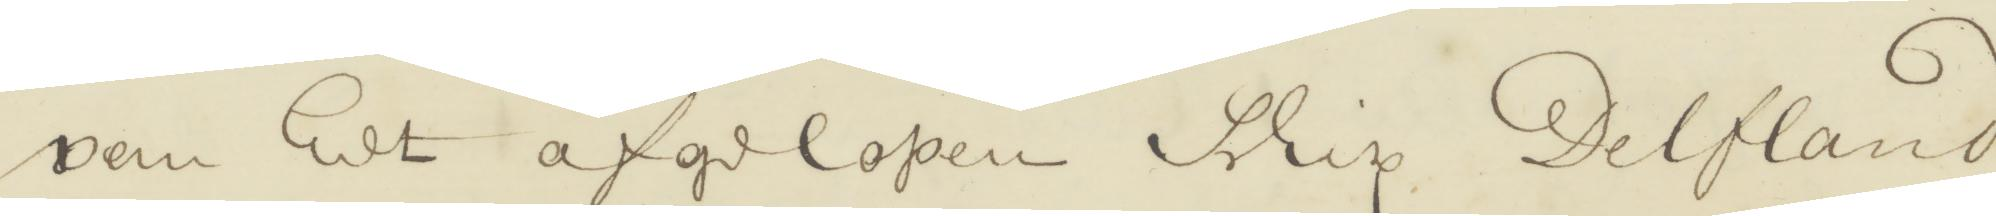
van het afgelopen schip Delfland
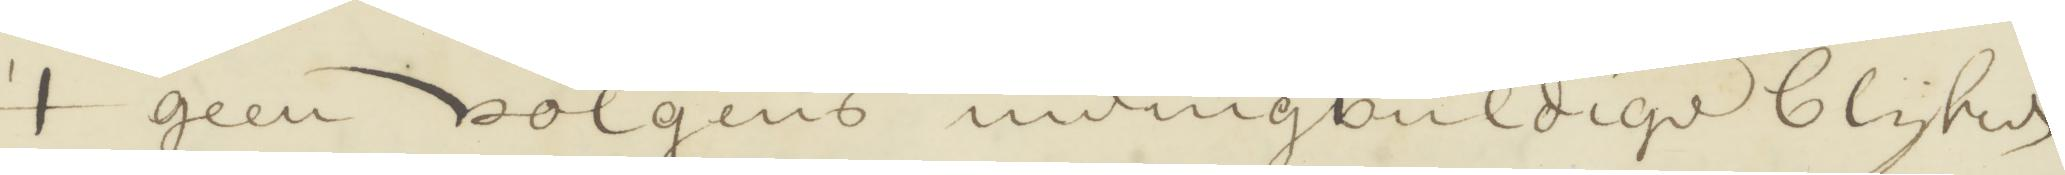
’t geen volgens menigvuldige blijken
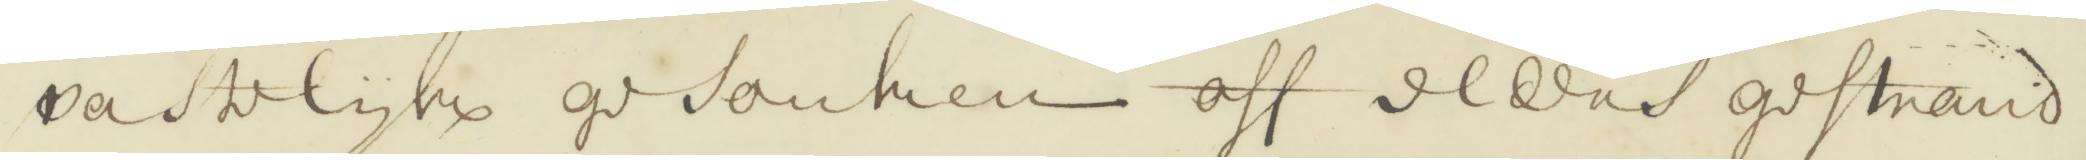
vastelijk gesonken off elders gestrand
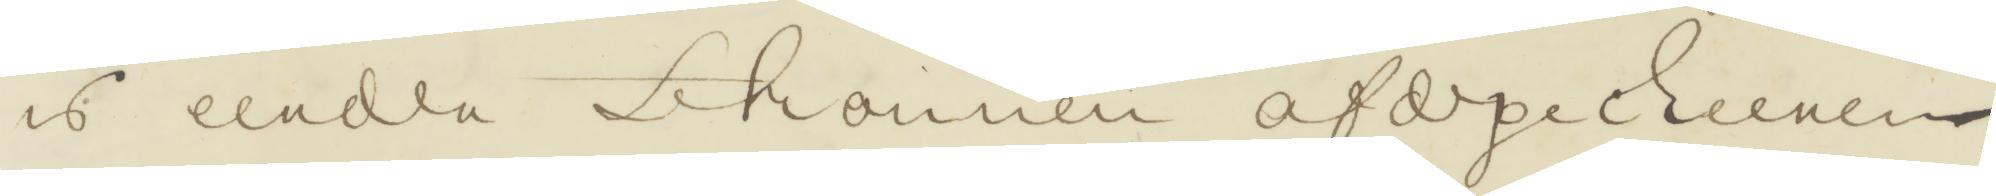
is eerder tekonnen afdepecheeren
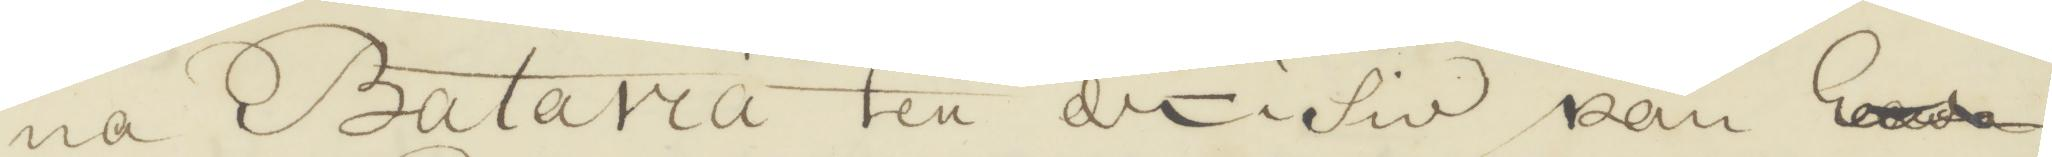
na Batavia ter decisie van haer
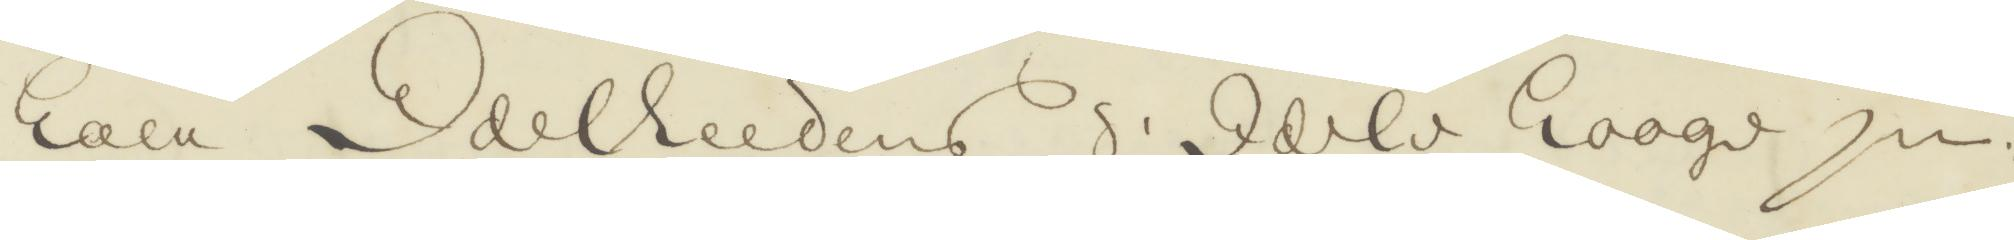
haer Edelheedens d’ Edele hooge jn
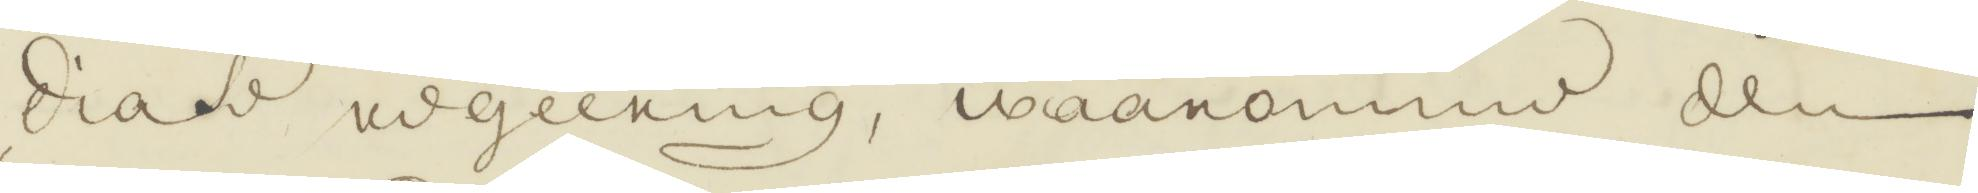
diase regeering, waaromme den
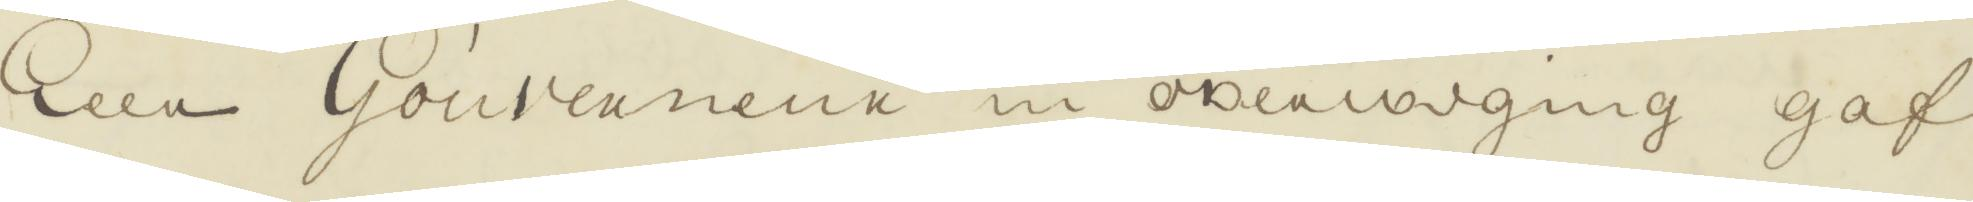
heer Gouverneur in overweging gaf
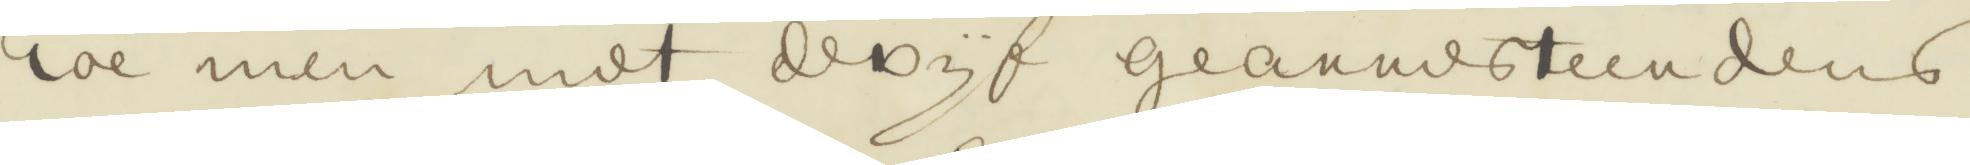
hoe men met de vijf gearresteerdens
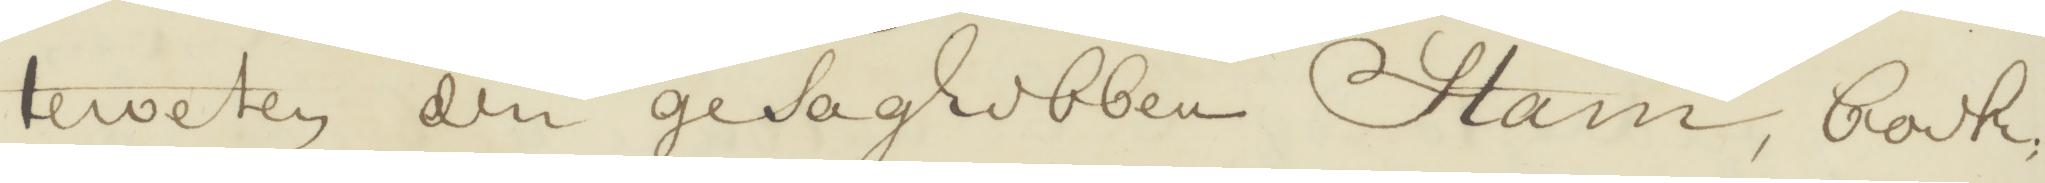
teweten den gesaghebben Stam, boek
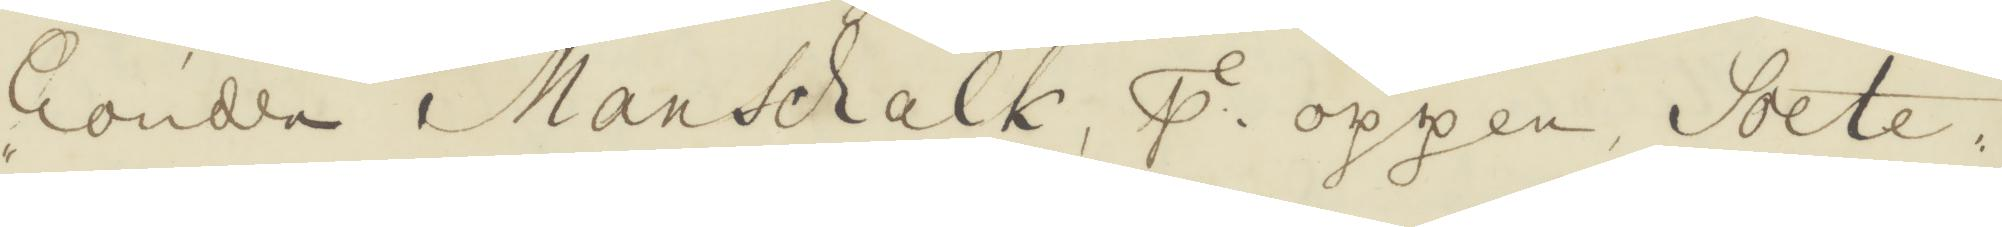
houder Marschalk, p:e opper, soete„
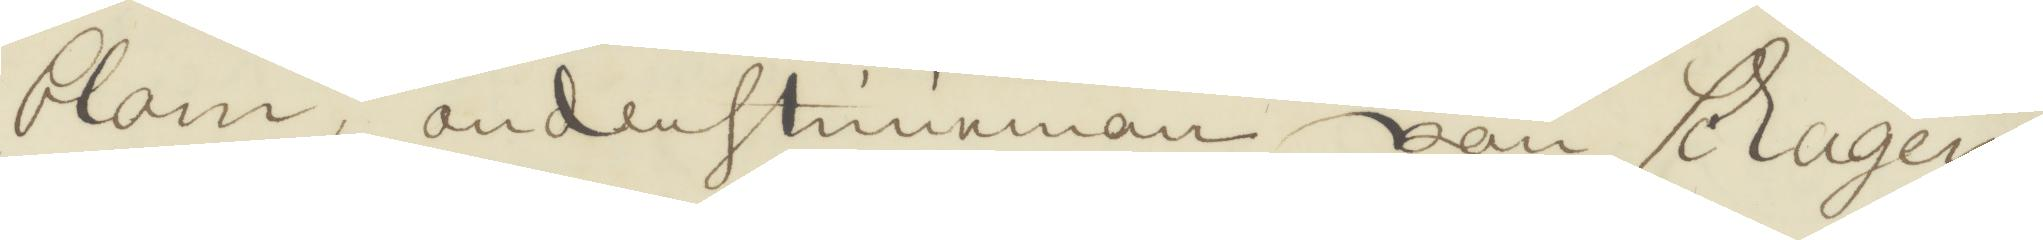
blom, onderstuurman van Schagen
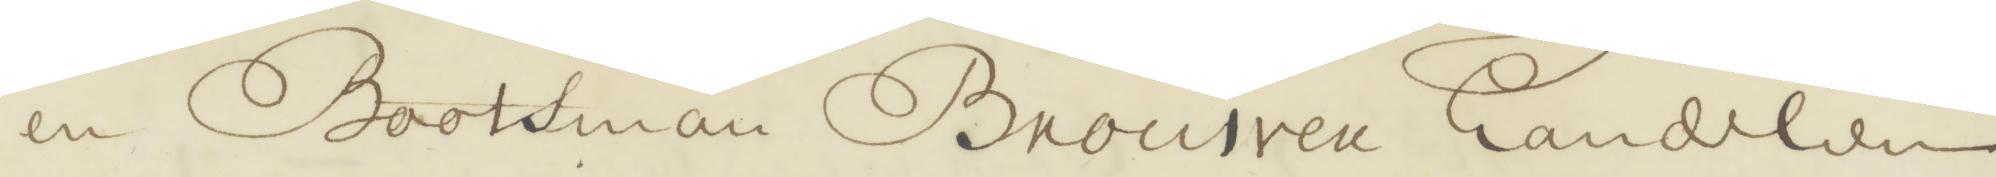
en Bootsman Brouwer handelen
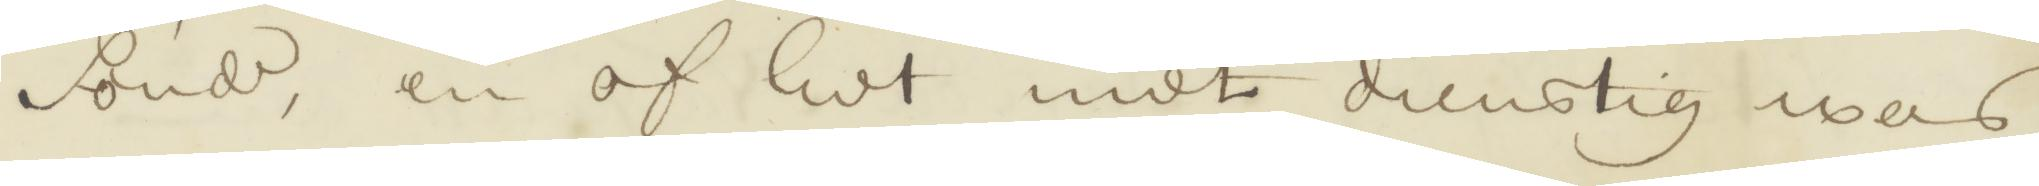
soude, en of het niet dienstig was
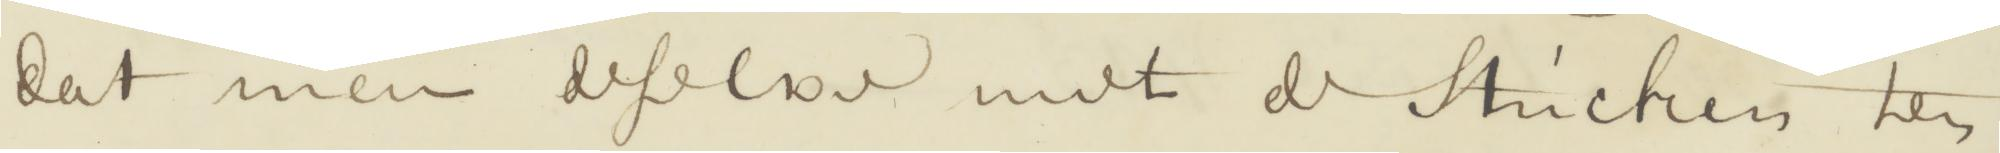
dat men deselve met de stucken ten
